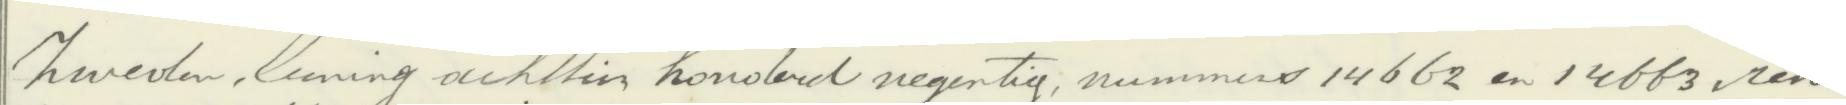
Zweden, leening achttien honderd negentig, nummers 14662 en 14663, ren
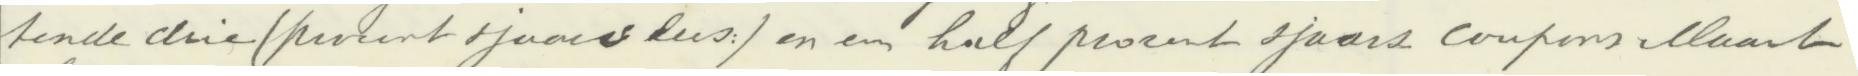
tende drie (procent sjaars Ens:) en een half procent sjaars coupons Maart
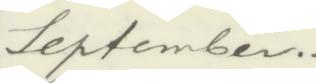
September.
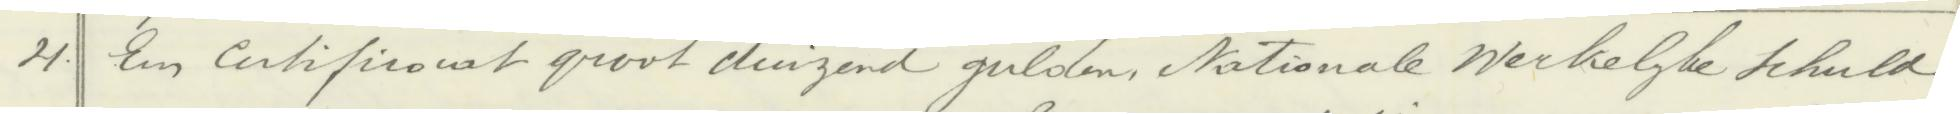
21. Een Certificaat groot duizend gulden, Nationale werkelyke schuld
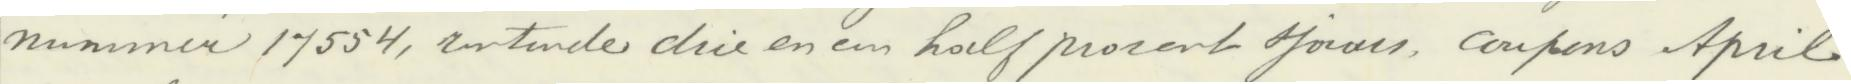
nummer 1754, rentende drie en een half procent sjaars, coupons April
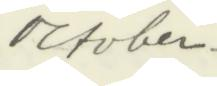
October.
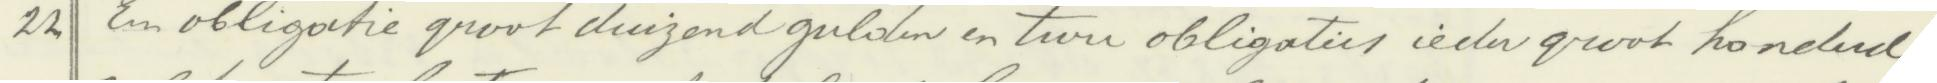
22 Een obligatie groot duizend gulden en twee obligaties ieder groot honderd
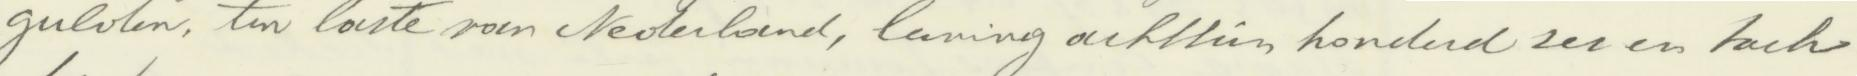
gulden, ten laste van Nederland, leening achttien honderd zes en tach
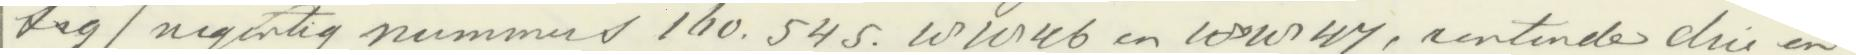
tig / negentig nummers 160. 545. 181846 en 181847, rentende drie en
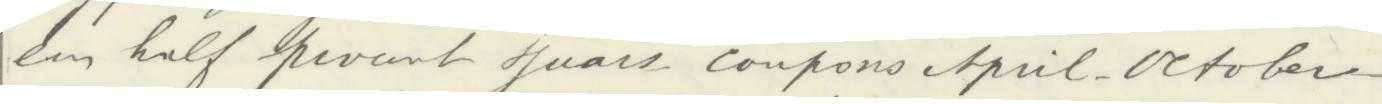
een half procent sjaars coupons April - October
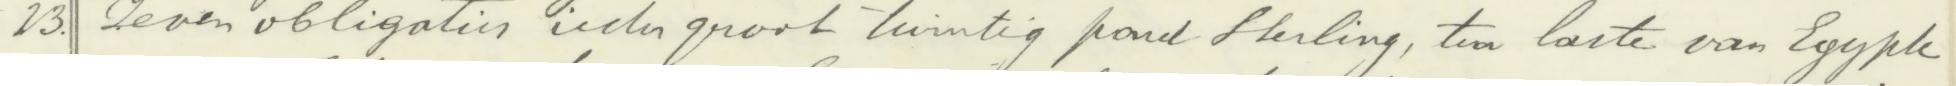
23. Zeven obligaties ieder groot twintig pond sterling, ten laste van Egypte
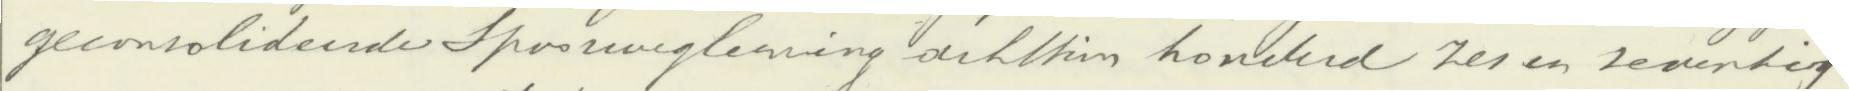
geconsolideerde Spoorwegleening achttien honderd zes en zeventig
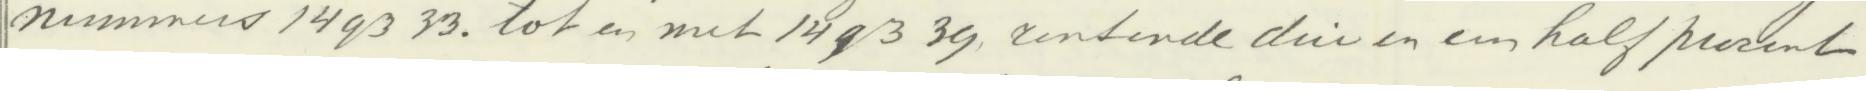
nummers 149333. tot en met 149339, rentende drie en een half procent
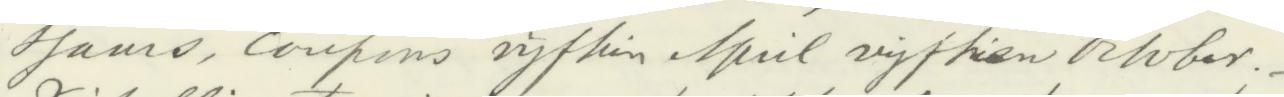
sjaars, coupons vijftien April vijftien October.
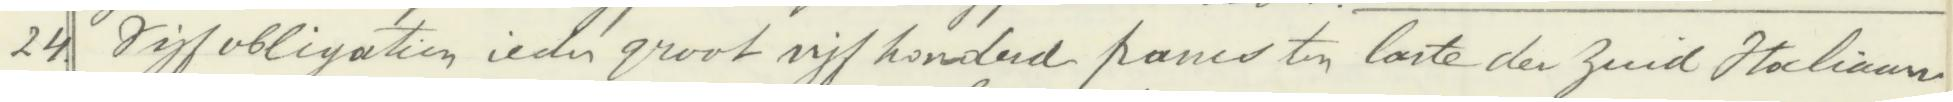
24. Vijf obligatien ieder groot vijf honderd francs ten laste der Zuid Italiaan
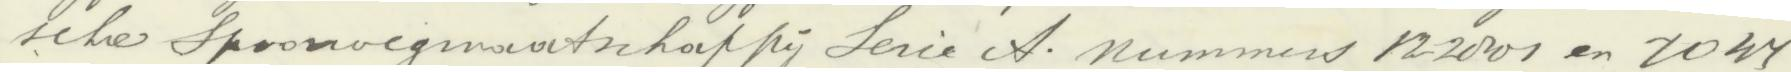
sche Spoorwegmaatschappij Serie A. nummers 122801 en 7047
